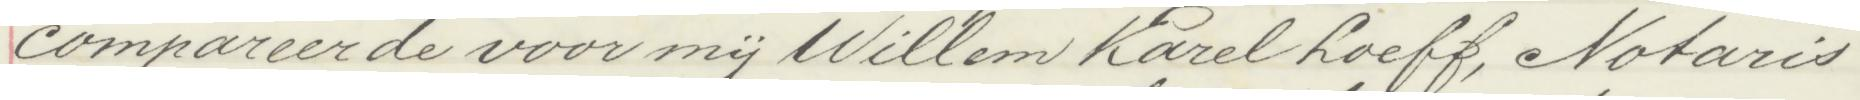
compareerde voor mij Willem Karel Loeff, Notaris
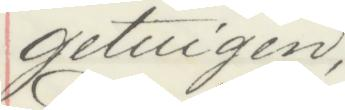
getuigen,
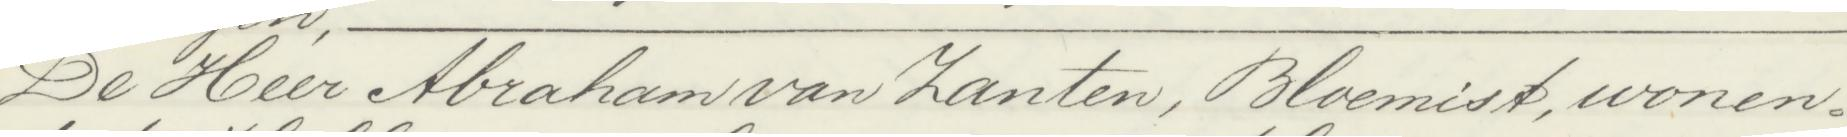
De Heer Abraham van Zanten, Bloemist, wonen=
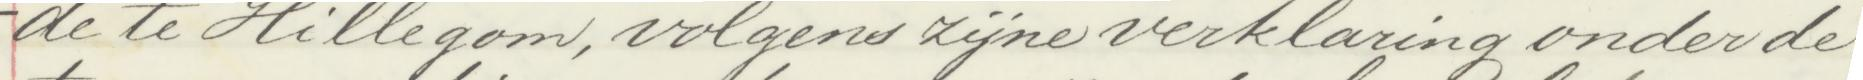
de te Hillegom, volgens zijne verklaring onder de
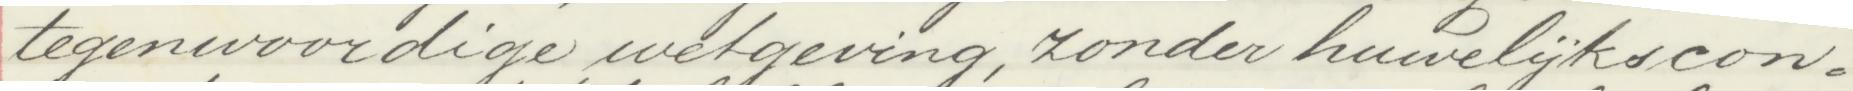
tegenwoordige wetgeving, zonder huwelijkscon=
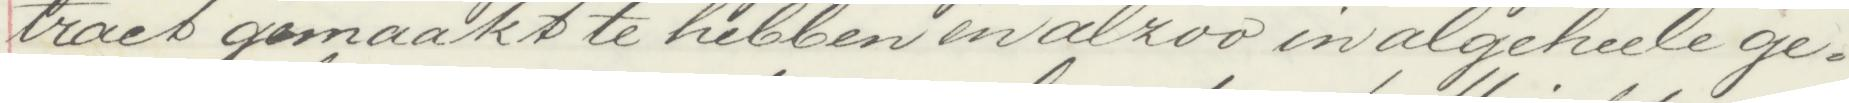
tract gemaakt te hebben en alzoo in algeheele ge=
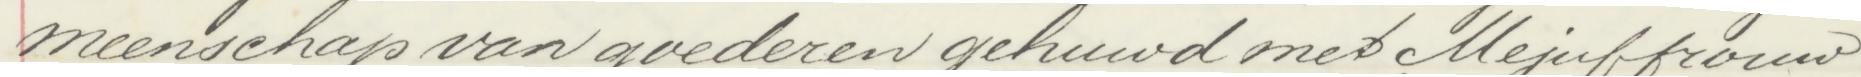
meenschap van goederen gehuwd met Mejuffrouw
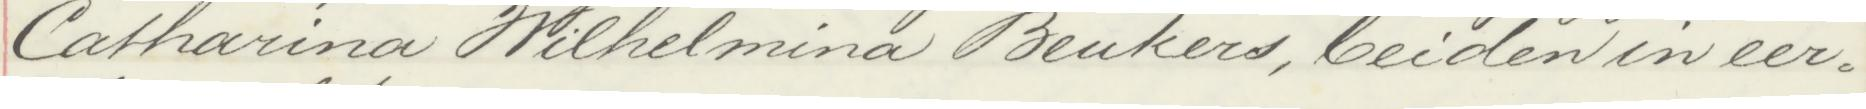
Catharina Wilhelmina Beukers, beiden in eer=
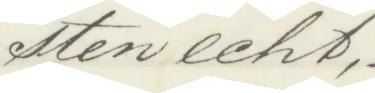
sten echt,
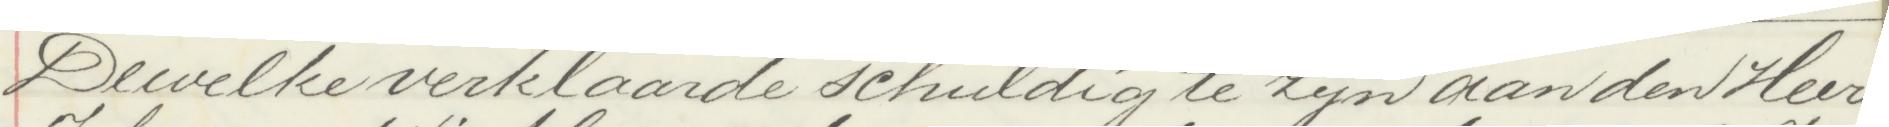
Dewelke verklaarde schuldig te zijn aan den Heer
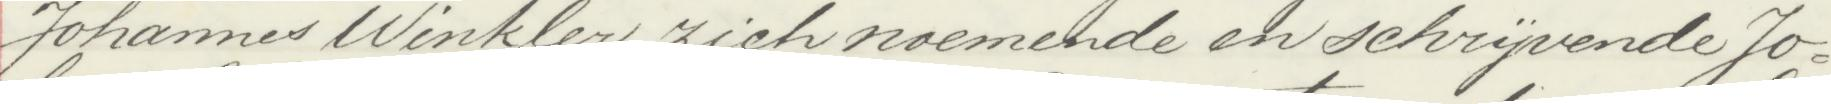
Johannes Winkler zich noemende en schrijvende Jo=
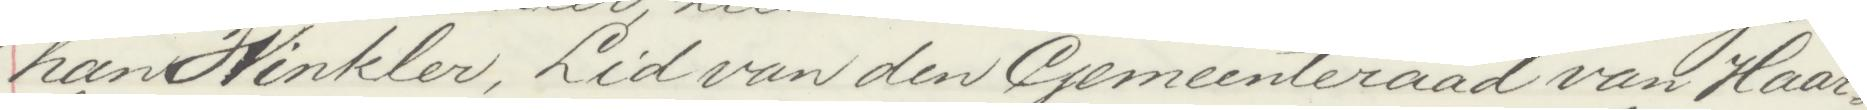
han Winkler, Lid van den Gemeenteraad van Haar„
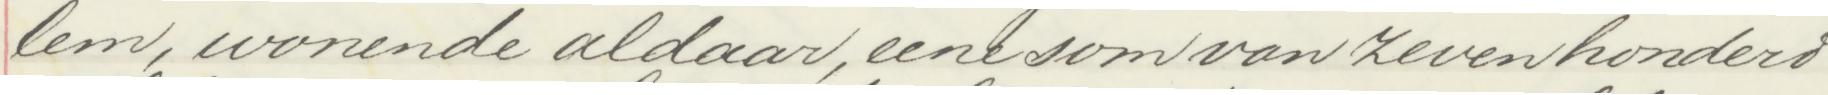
lem, wonende aldaar, eene som van zeven honderd
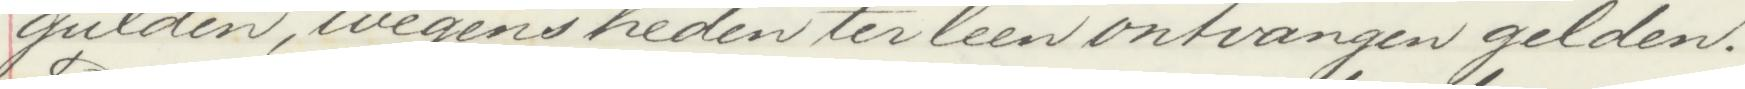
gulden, wegens heden, ter leen ontvangen gelden.
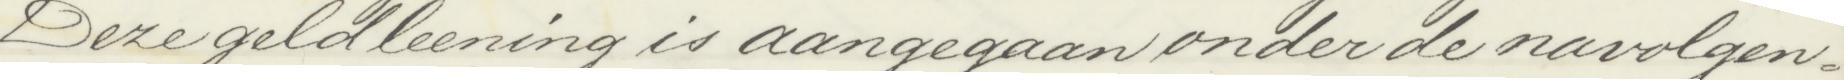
Deze geldleening is aangegaan, onder de navolgen„
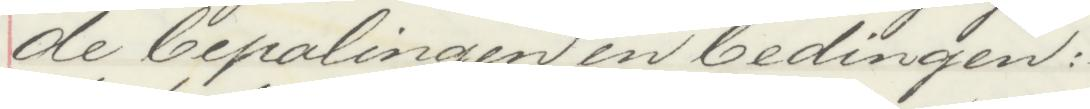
de bepalingen en bedingen:
